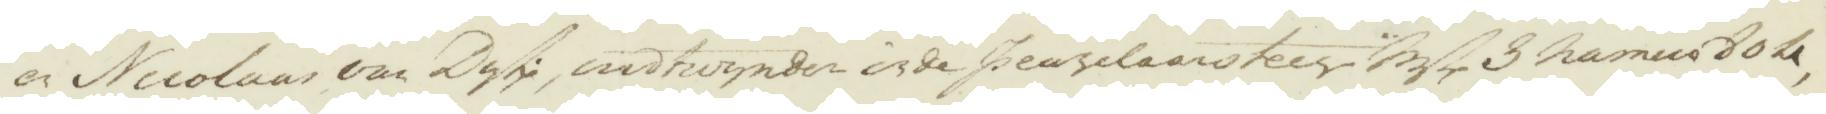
en Nicolaas van Dyk, ondtwijnder in de peuzelaarsteeg Wyk 3 numero 804,
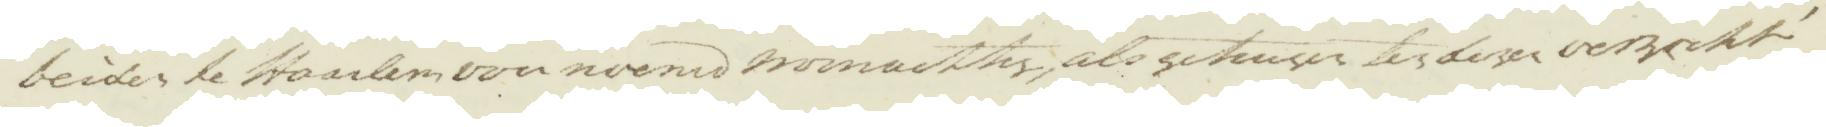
beiden te Haarlem voornoemd woonachtig, als getuigen ten dezen verzocht,
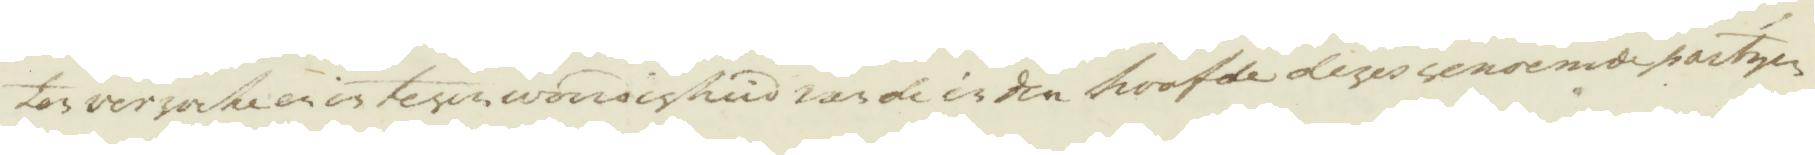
ten verzoeken en in tegen woordigheid van de in den hoofde dezes genoemde partyen
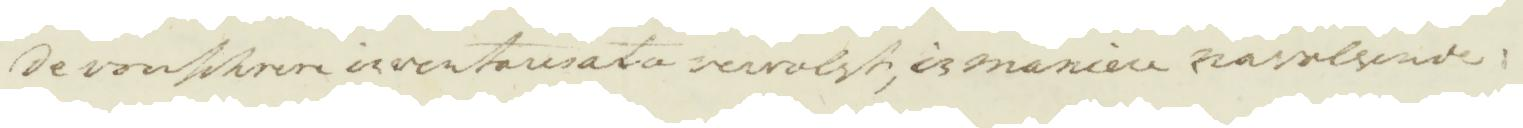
de voorschreven inventarisatie vervolgt, in maniere navolgende:
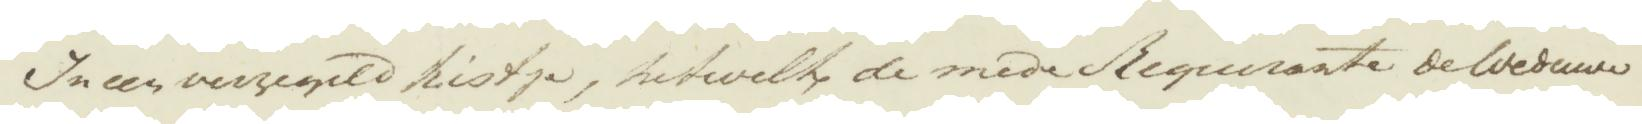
In een verzegeld kistje, hetwelk de mede Requirante de weduwe
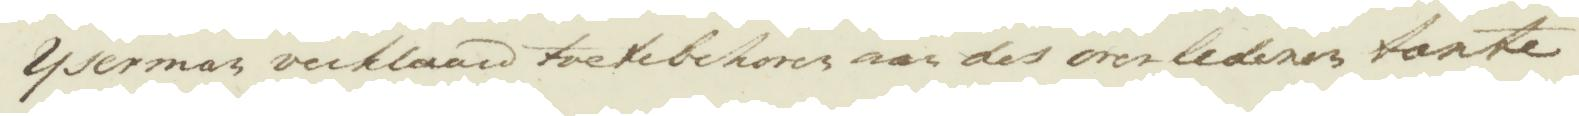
Yserman verklaard toetebehoren aan des overledenen tante
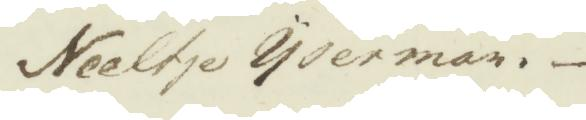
Neeltje IJserman.
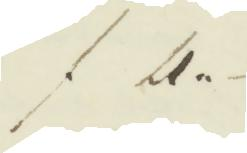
ƒ 4„
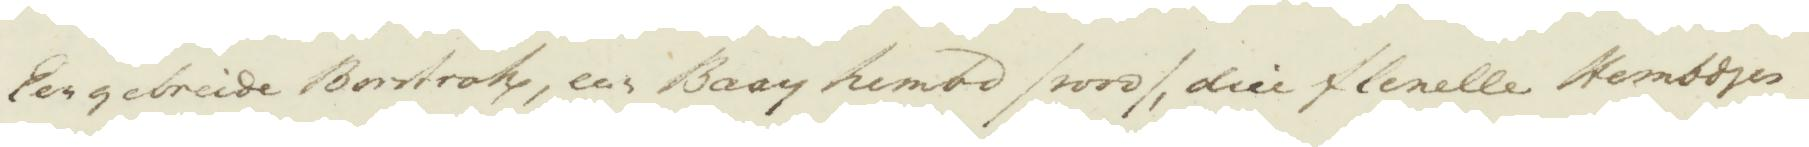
Een gebreide Borstrok, een Baay hembd /rood/, drie flenelle Hembdjes
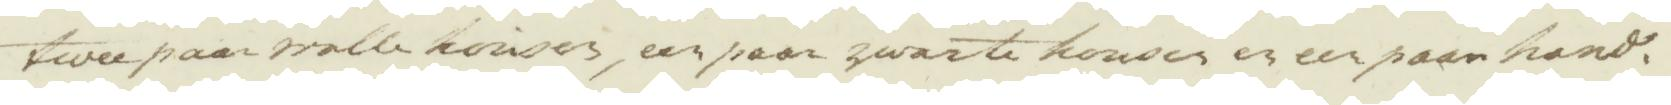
twee paar wolle kousen, een paar zwarte kousen en een paar hand.
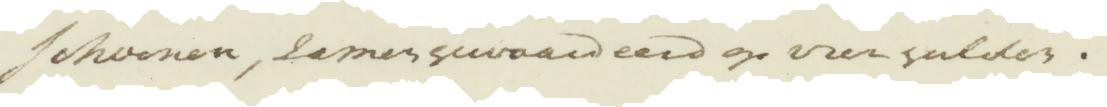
schoenen, zemen gewaardeerd op vier gulden.
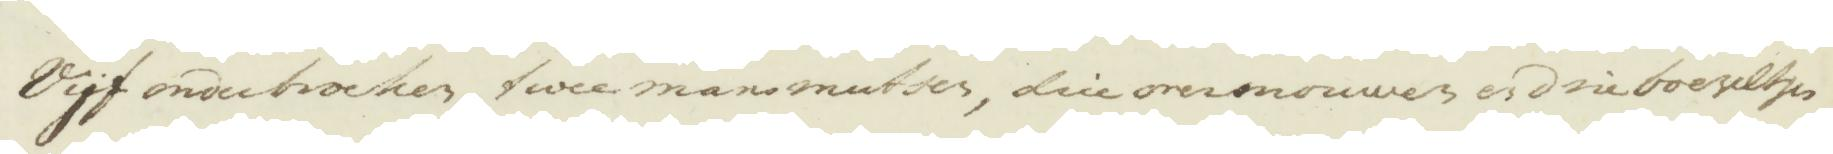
Vijf onderbroeken, twee mans mutsen, drie overmouwen en drie boezeltjes
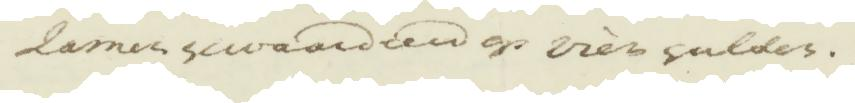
Zamen gewaardeerd op vier gulden.
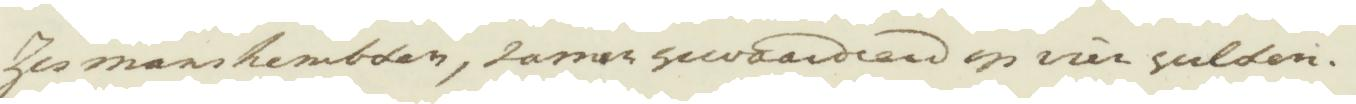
Zes mans hembden, zamen gewaardeerd op vier gulden.
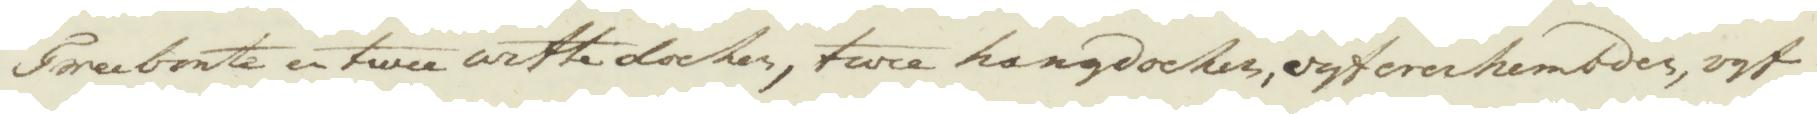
Twee bonte en twee witte doeken, twee hangdoeken, vyf overhembden, vyf
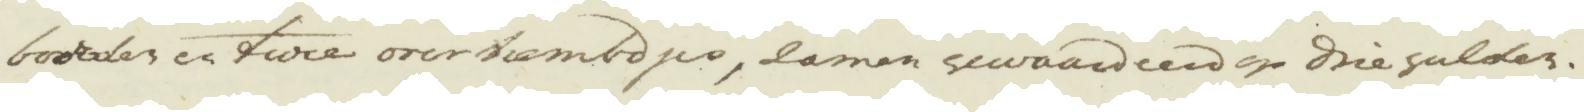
boorden en twee overhembdjes, zamen gewaardeerd op drie gulden.
